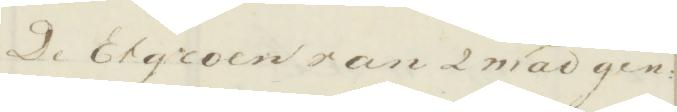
De Etgroen van 2 mad gen:
